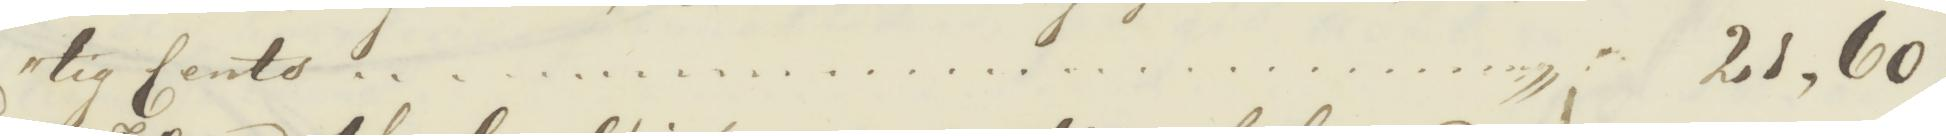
tig Cents . . . . . . . . . . . . . . . . . . . . . . . . . . . . . . . „ 21,60
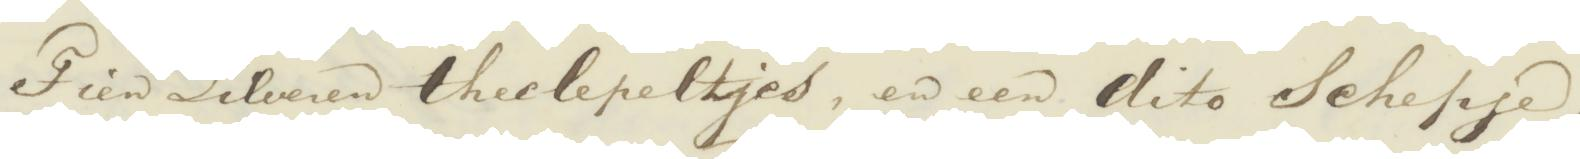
Tien zilveren theelepeltjes, en een dito schepje
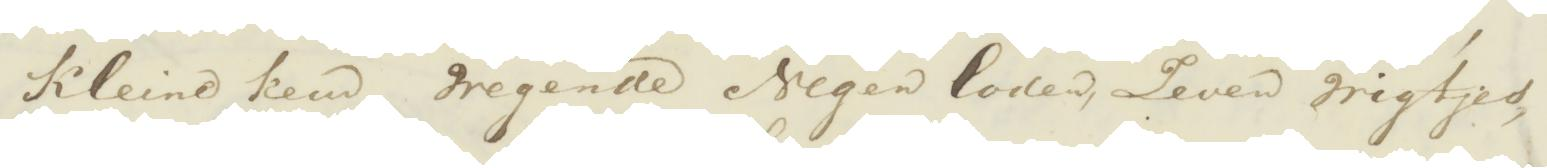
kleine keur wegende Negen loden, zeven wigtjes,
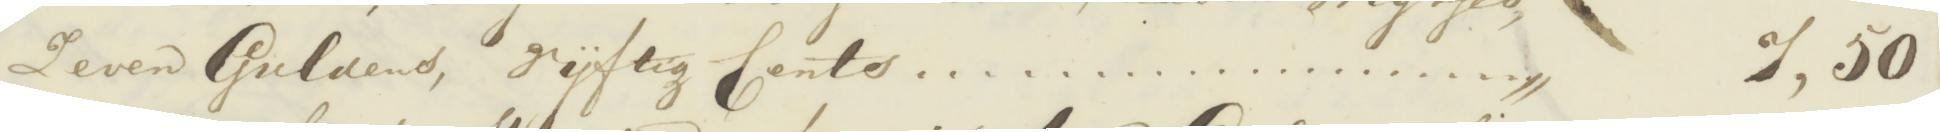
zeven Guldens, vijftig Cents . . . . . . . . . . . . . . . . . . . „ 7,50
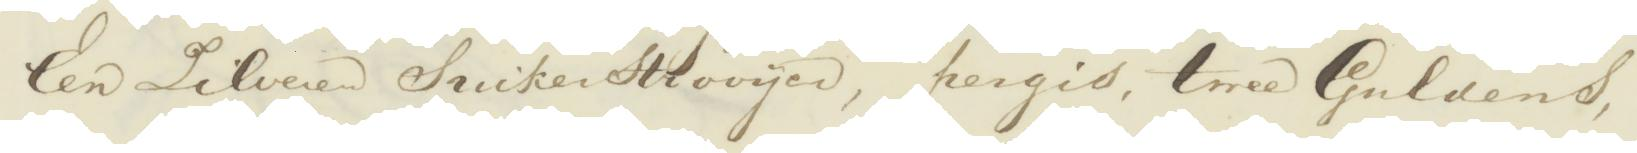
Een zilveren suikerstrooijer, pergis, twee Guldens,
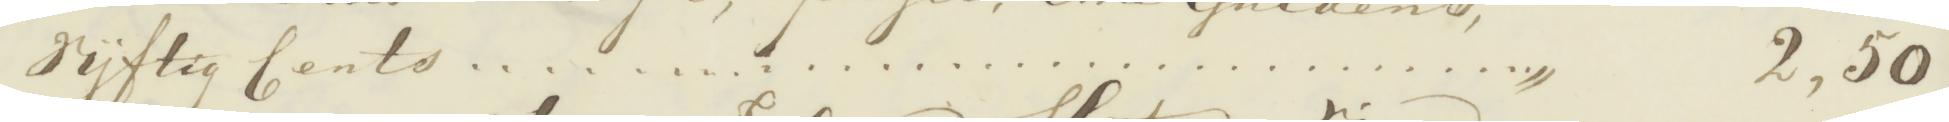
vijftig Cents . . . . . . . . . . . . . . . . . . . . . . . . . . . . . . „ 2,50
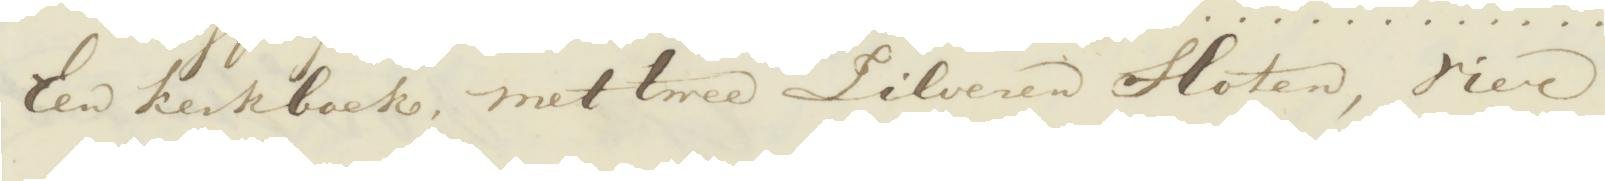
Een kerkboek, met twee zilveren sloten, vier
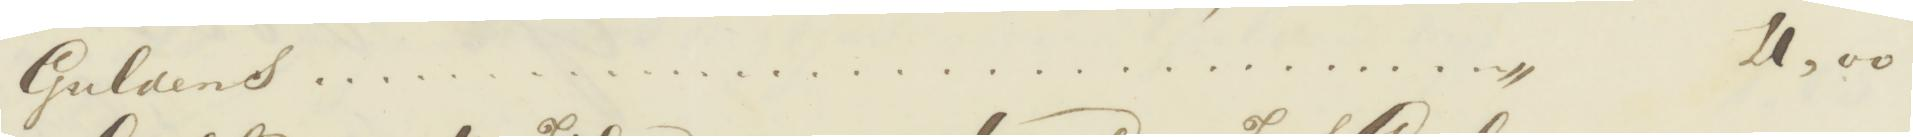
Guldens . . . . . . . . . . . . . . . . . . . . . . . . . . . . . . . „ 4,00
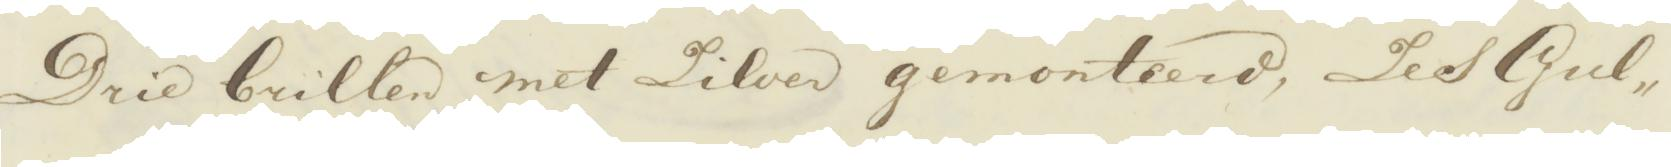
Drie brillen met zilver gemonteerd, zes Gul„
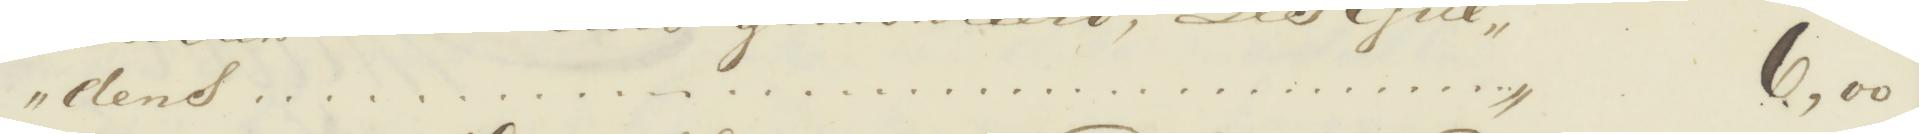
„dens . . . . . . . . . . . . . . . . . . . . . . . . . . . . . . . . . . . „ 6,00
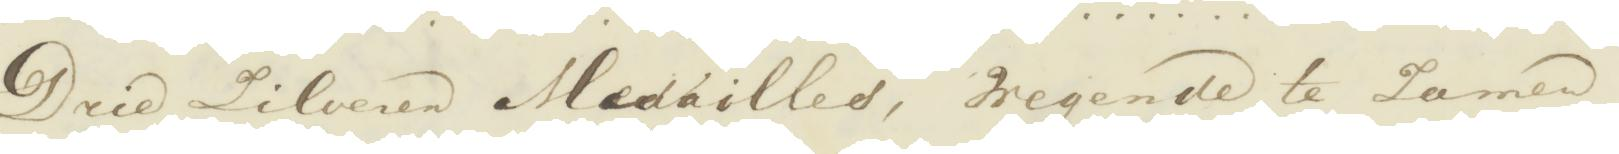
Drie zilveren Medailles, wegende te zamen
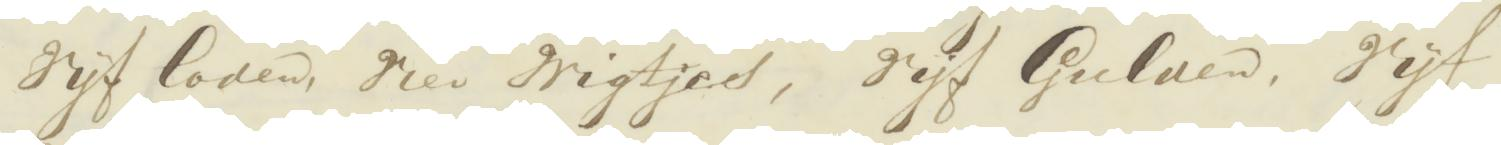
vijf loden, vier wigtjes, vijf Gulden, Vijf
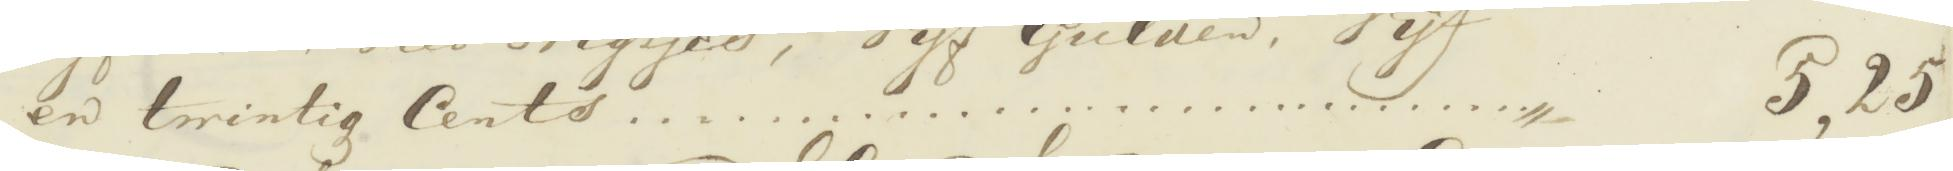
en twintig Cents . . . . . . . . . . . . . . . . . . . . . . . . . . . . . „ 5,25
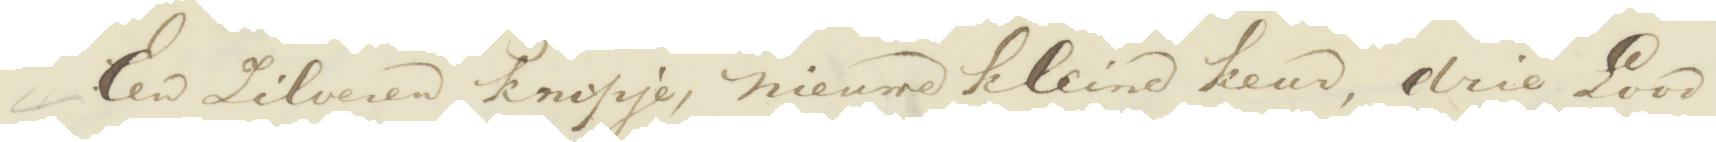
Een zilveren knopje, nieuwe kleine keur, drie Lood
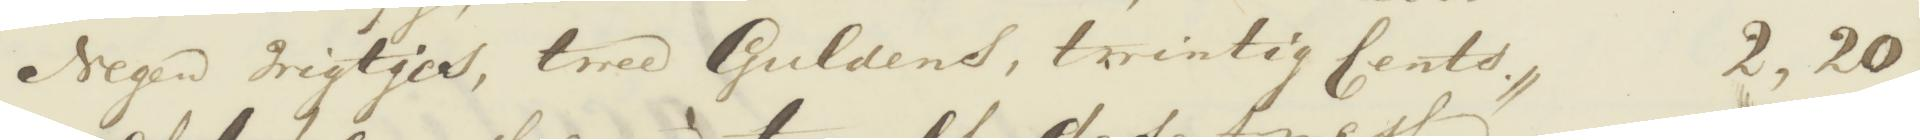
Negen wigtjes, twee Guldens, twintig Cents.„ 2,20
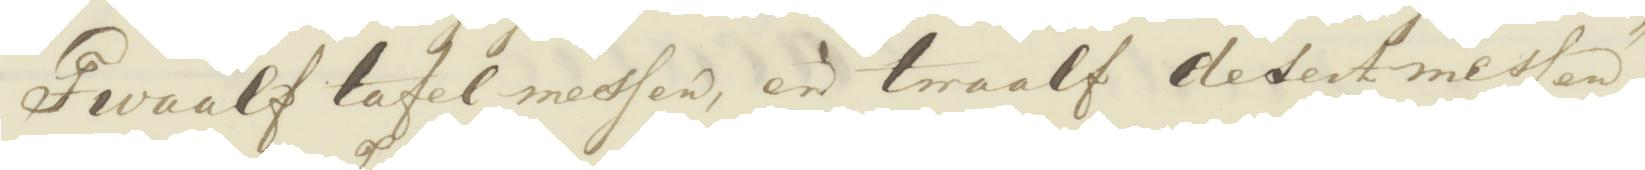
Twaalf tafel messen, en twaalf desert messen
